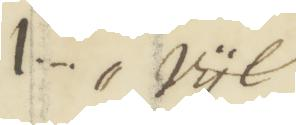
1.-. „ vijl
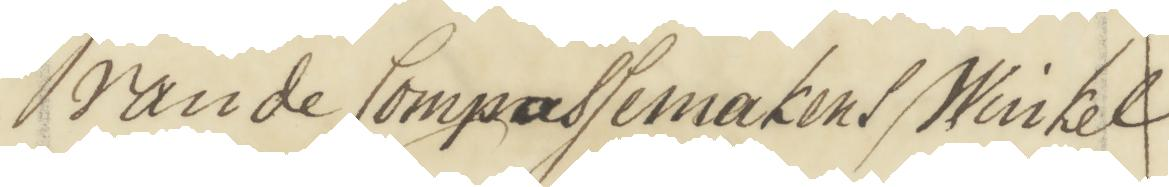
van de Compassemakers Winkel
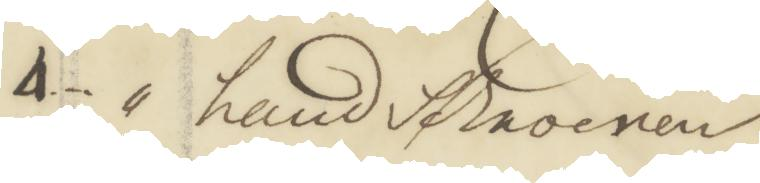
4.-. „ handschroeven
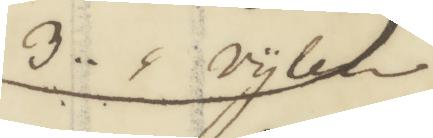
3.- „ vijlen
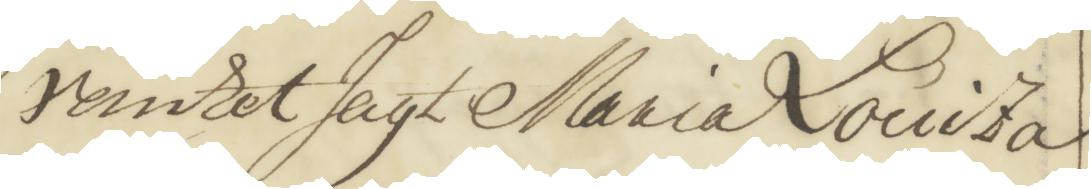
van het Jagt Maria Louiza
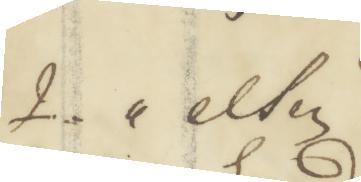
2..- „ elsen
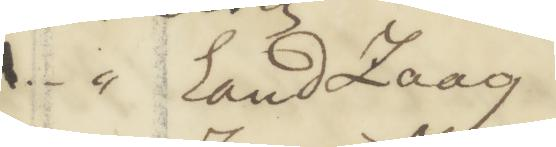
1.- „ hand zaag
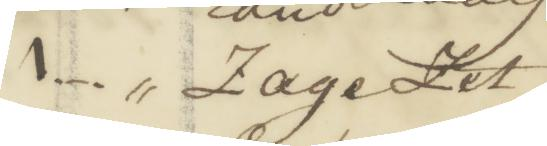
1.-. „ zagezet
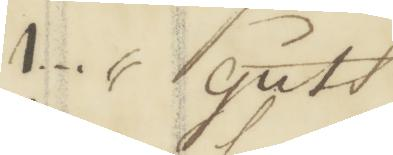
1.-. „ guts
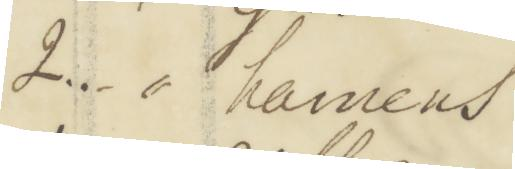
2..- „ kamers
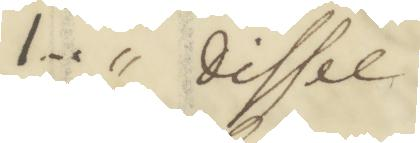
1.-. „ dissel
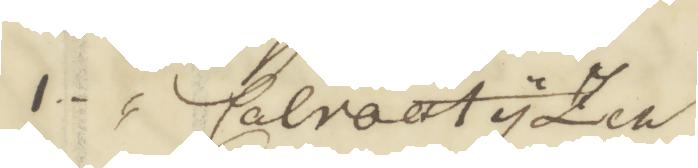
1.- „ Calvaatijzer
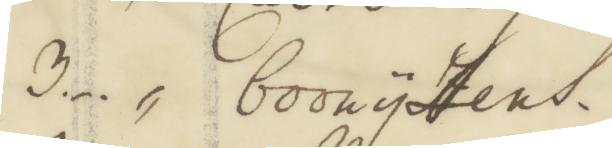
3.-. „ boorijzers.
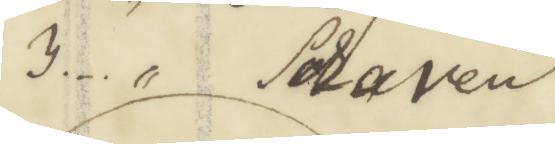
3.-. „ schaven
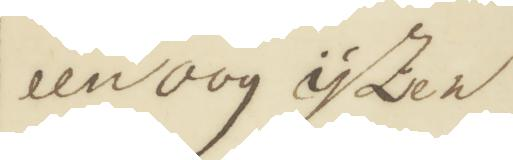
een oog ijzer
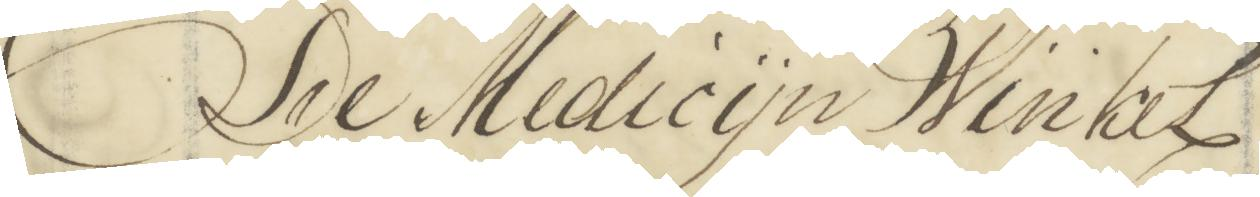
De Medicijn Winkel
